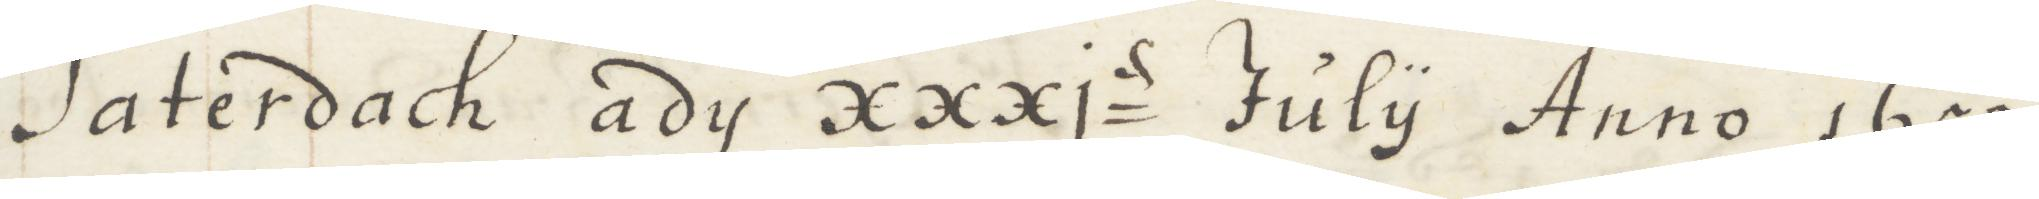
Saterdach adij xxxj=en Iulij Anno 1655
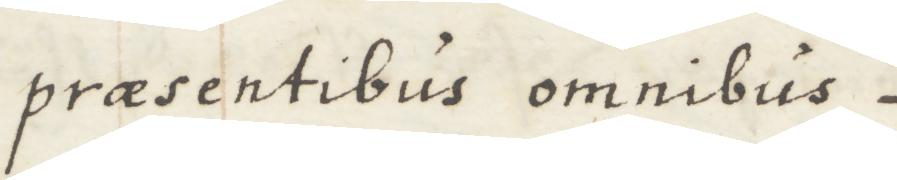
praesentibus omnibus
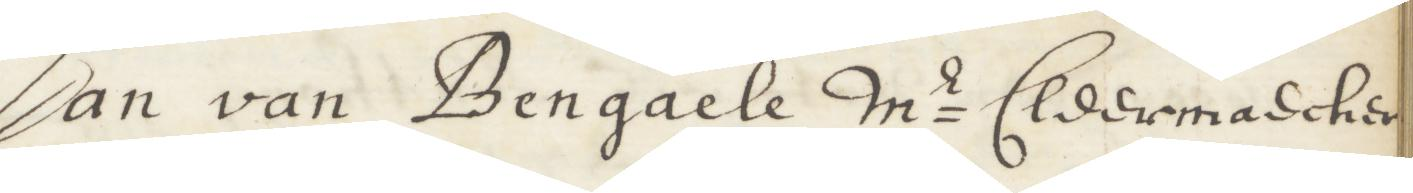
Jan van Bengaele m=r Cleermaecker
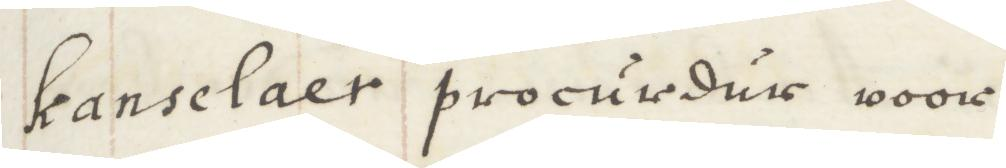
kanselaer procureur voor
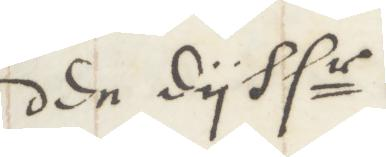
den Eijss=r
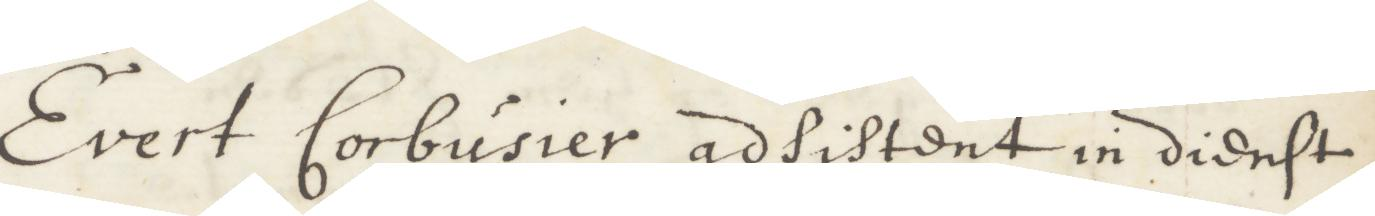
Evert Corbusier adsistent in dienst
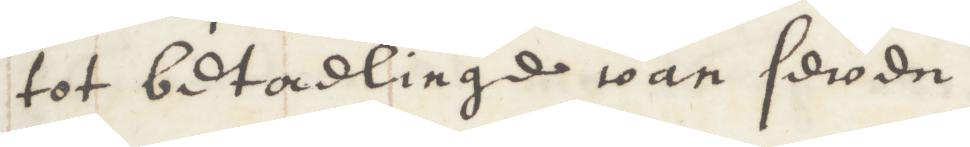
tot betaelinge van seven
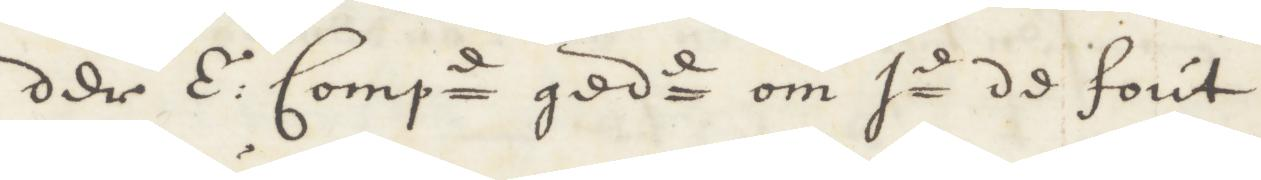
der E: Comp=e ged=e om J=e de fout
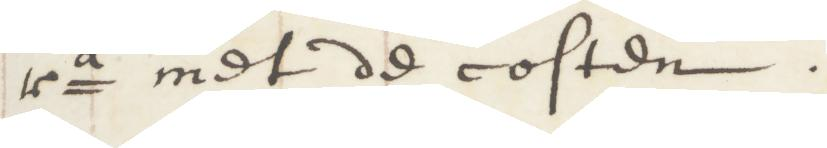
r=a met de costen.
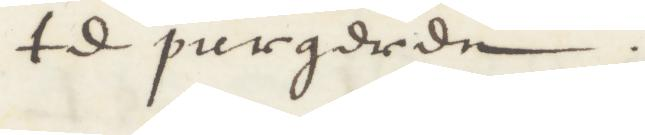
te purgeren.
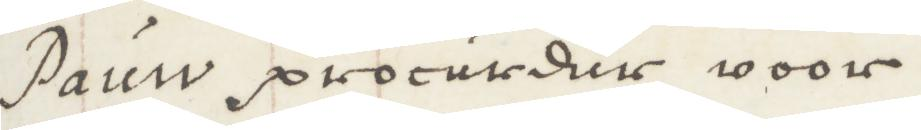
Pauw procureur voor
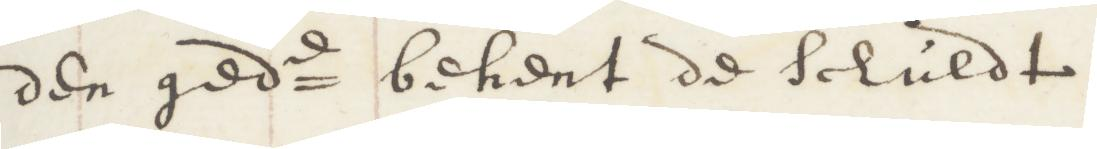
den ged=e bekent de schuldt
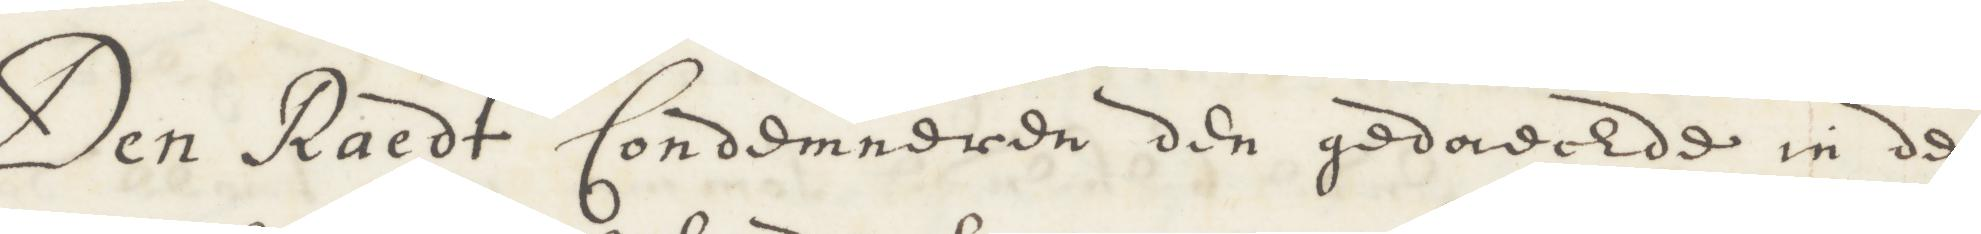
Den Raedt Condemneren den gedaechde in de
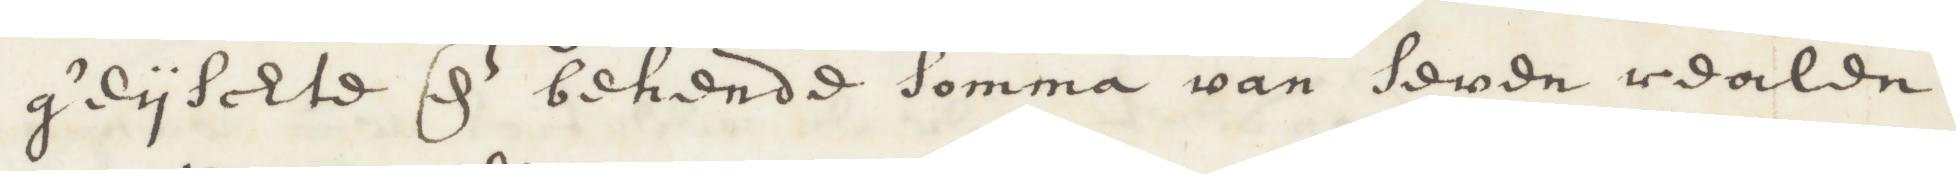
g’eijschte ende bekende somma van seven realen
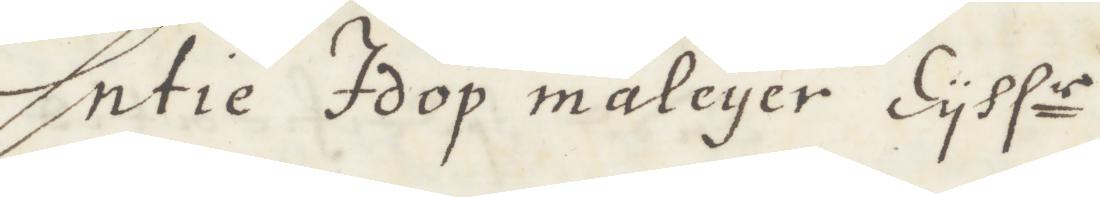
Jntie Idop maleijer Eijss=r
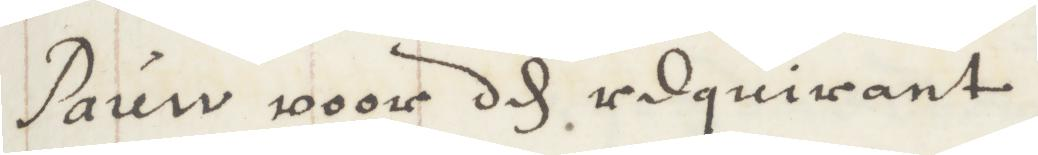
Pauw voor den requirant
